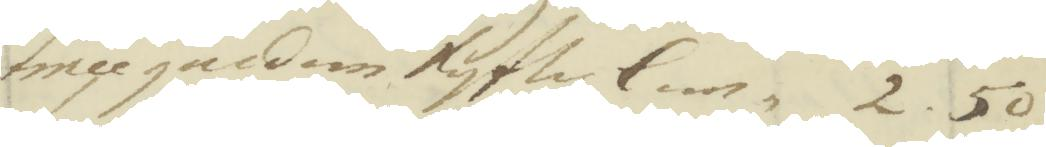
twee guldens Vyftig Cent „ 2. 50
